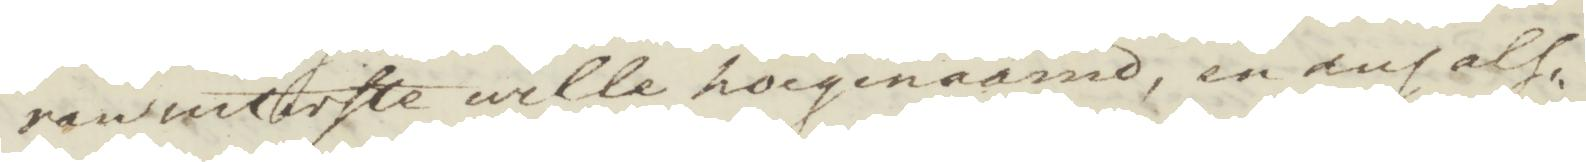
van uiterste wille hoegenaamd, en dus als„
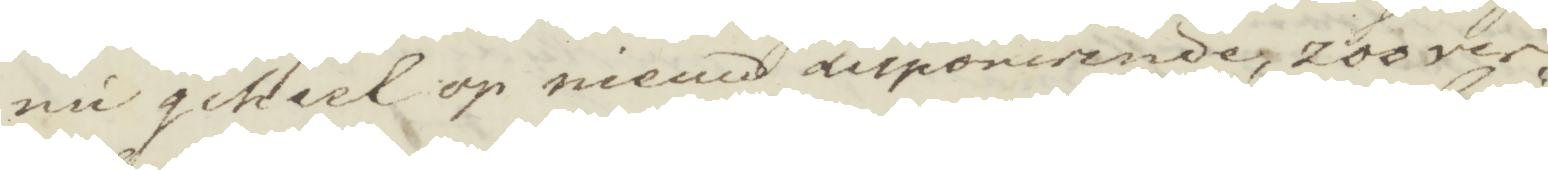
„nu geheel op nieuw disponerende, zoo ver
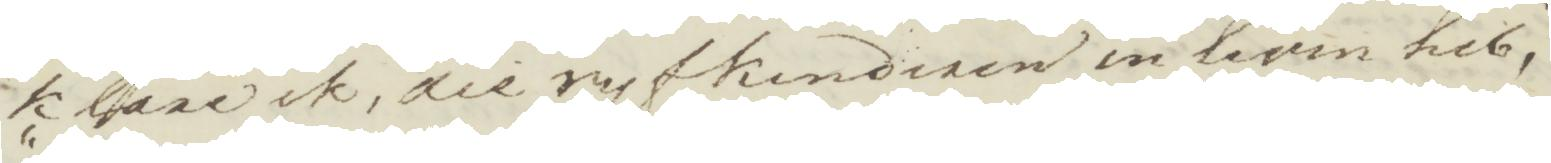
klare ik, die vyf kinderen in leven heb,
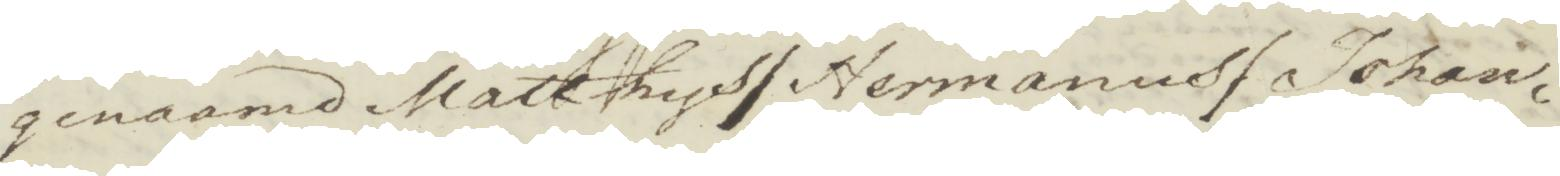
genaamd Matthys / Hermanus / Johan„
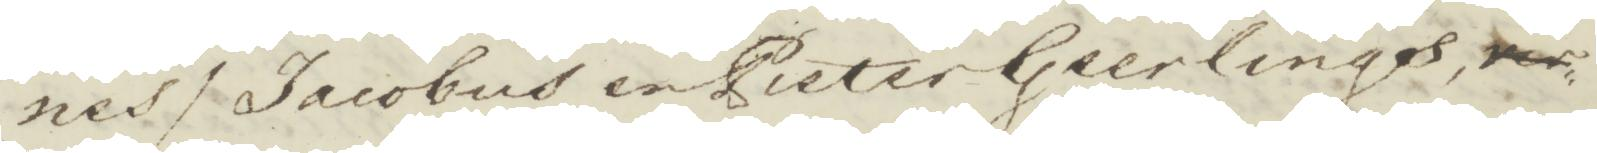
nes / Jacobus en Pieter Geerlings, ver„
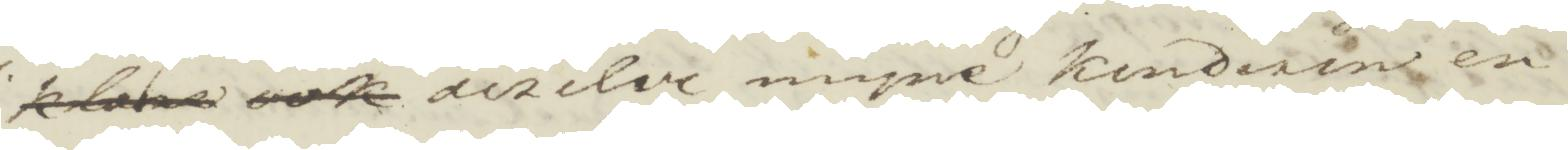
klare ook dezelve myne kinderen en
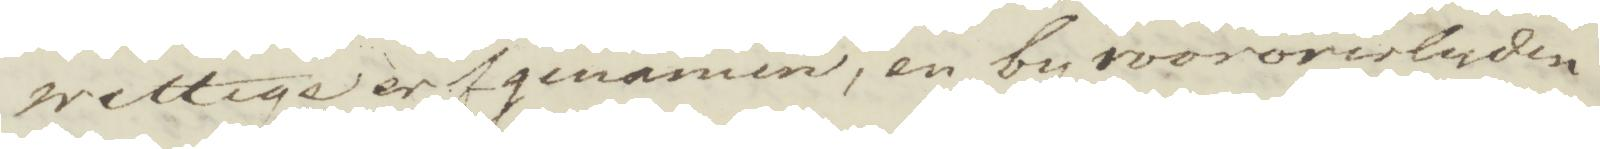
wettige erfgenamen, en by vooroverlyden
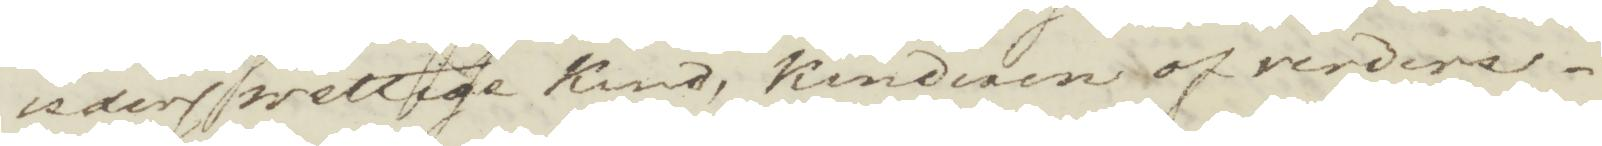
ieders wettige kind, kinderen of verdere –
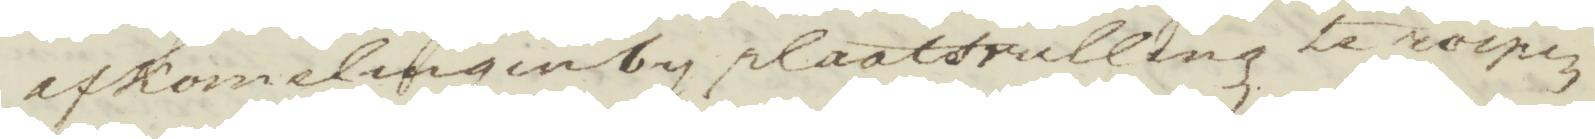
afkomelingen by plaatsvulling te roepen
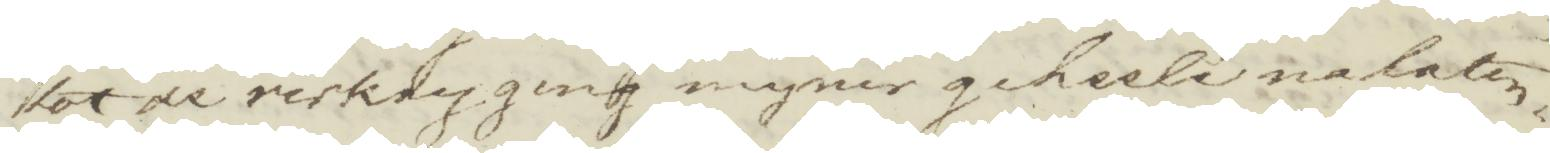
tot de verkryging myner geheele nalaten
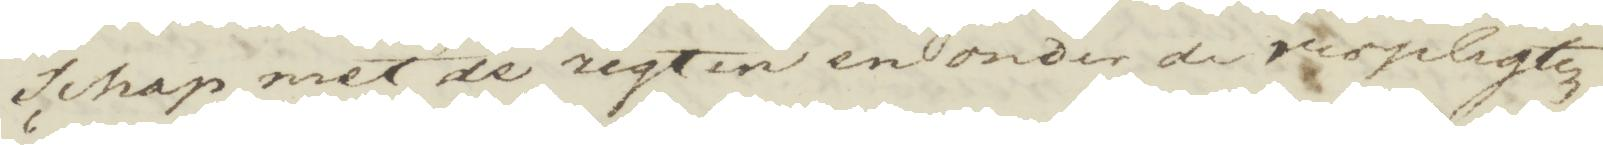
„schap met de regten en onder de verpligtin
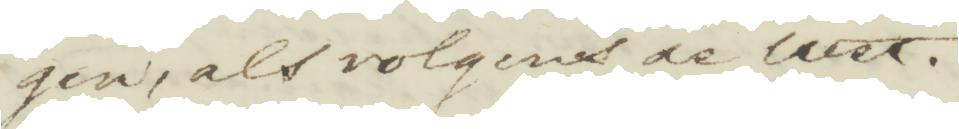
gen, als volgens de wet.
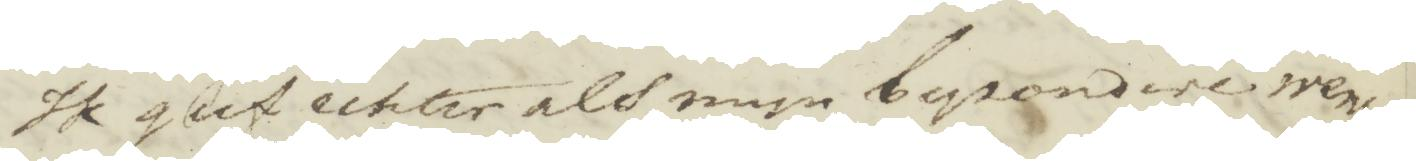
Ik geef echter als myn bysondere wench
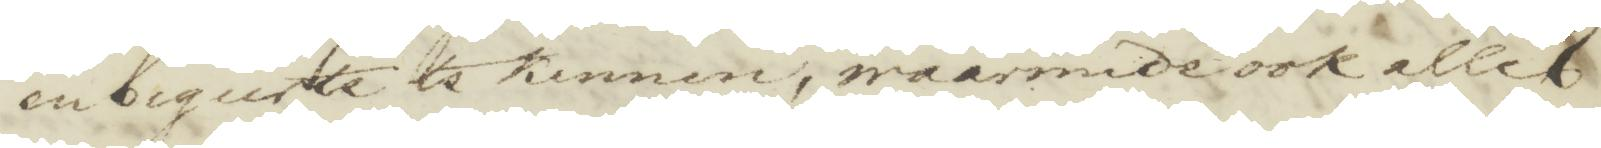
en begeerte te kennen, waarmede ook alle
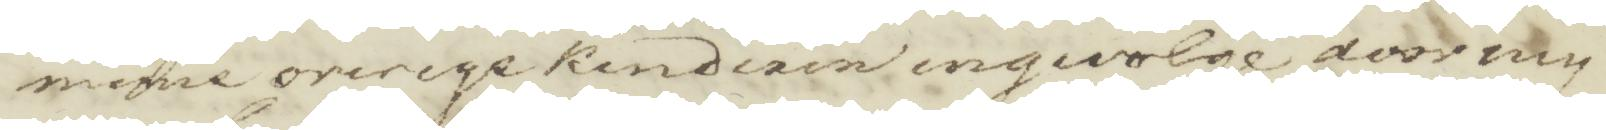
myne overige kinderen in gevolge door my
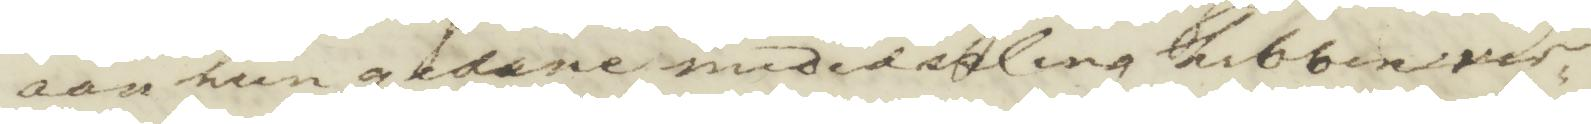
aan hun gedane mededeeling hebben ver„
